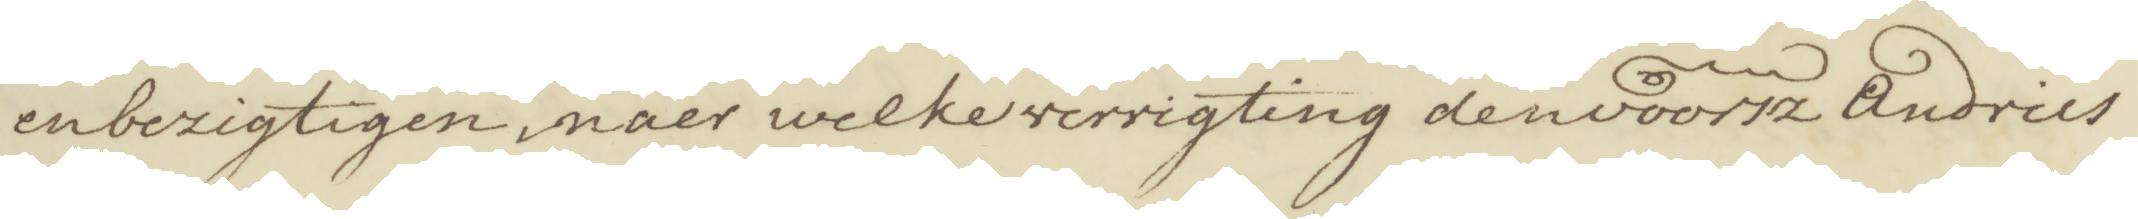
en bezigtigen, naer welke verrigting den voorsz: Andries
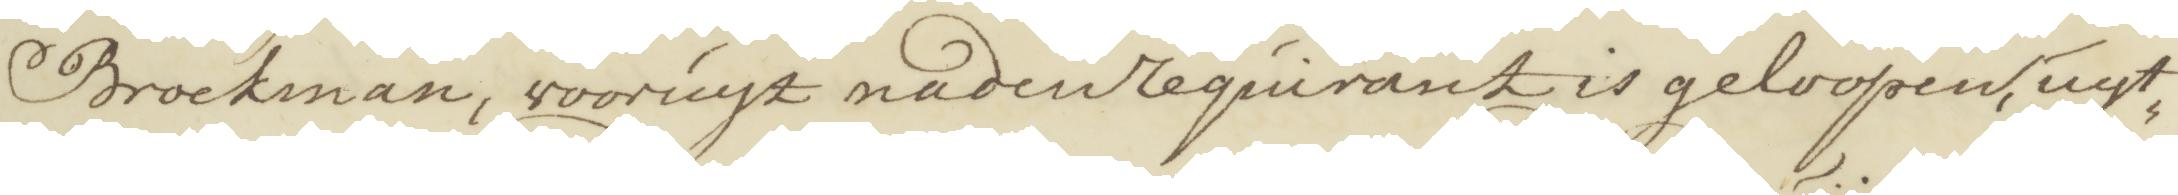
Broekman, vooruyt na den requirant is geloopen, uyt„
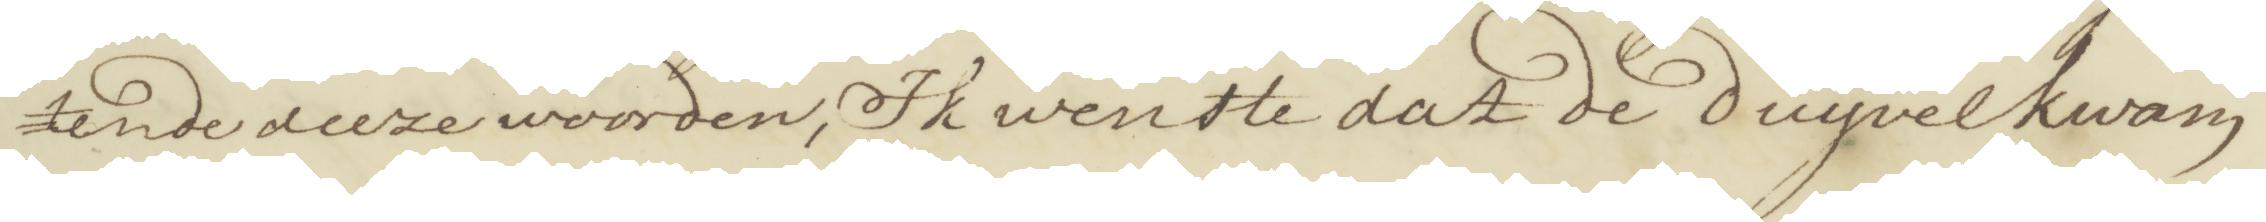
„tende deeze woorden, Ik wenste dat de duijvel kwam
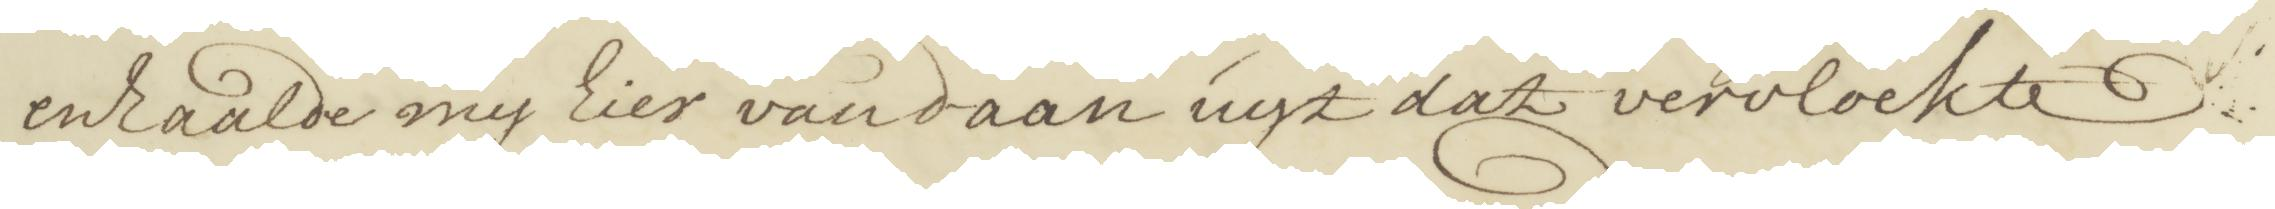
en haalde mij hier vandaan uyt dat vervloekte
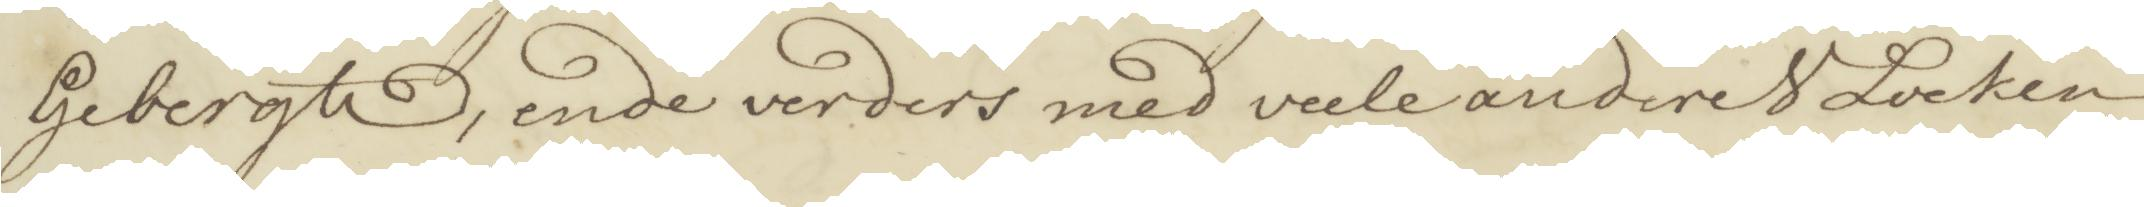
Gebergte, ende verders med veele andere verzoeken
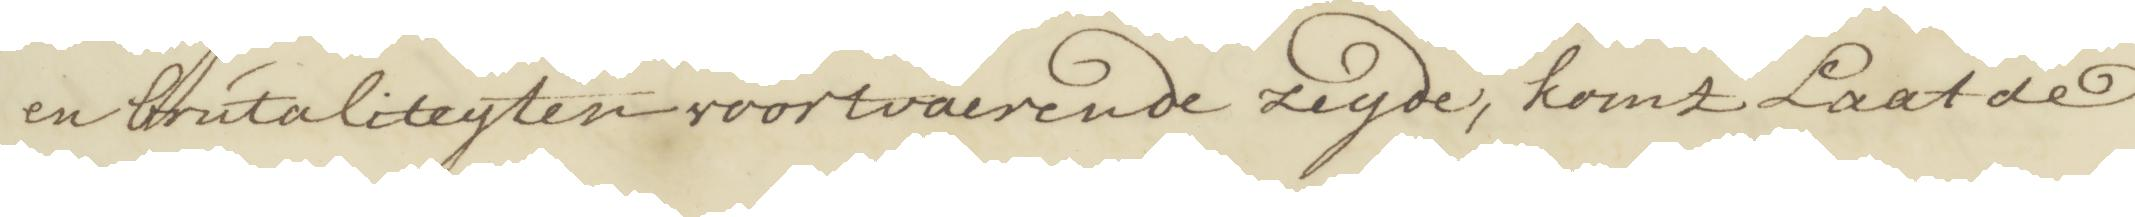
en brutaliteyten voortvaerende zeyde, komt laat de
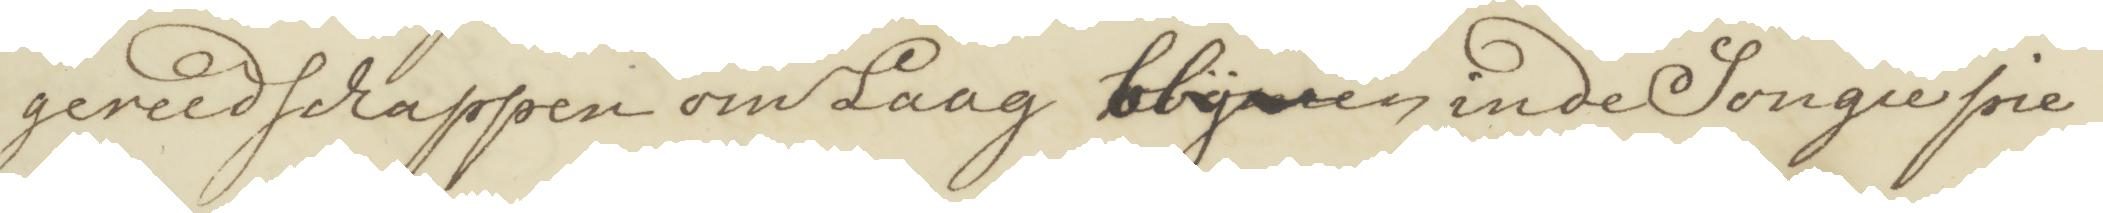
gereedschappen omlaag blijven in de songie pie
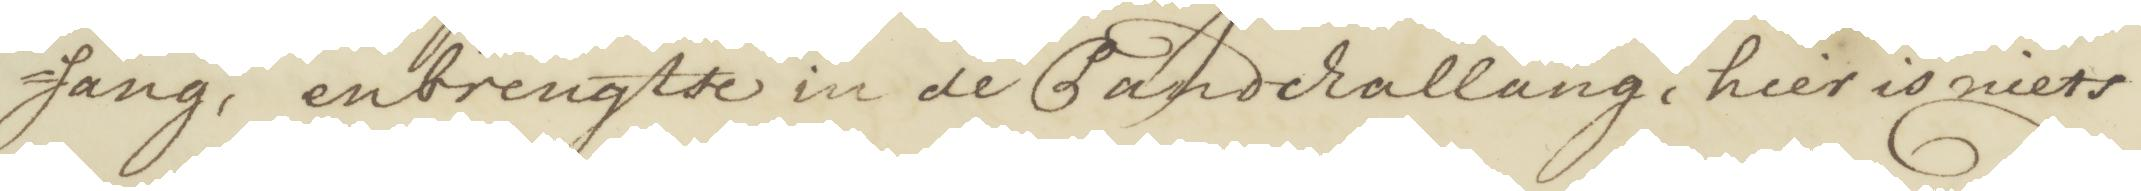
„sang, en brengtse in de Pandchallang, hier is niets
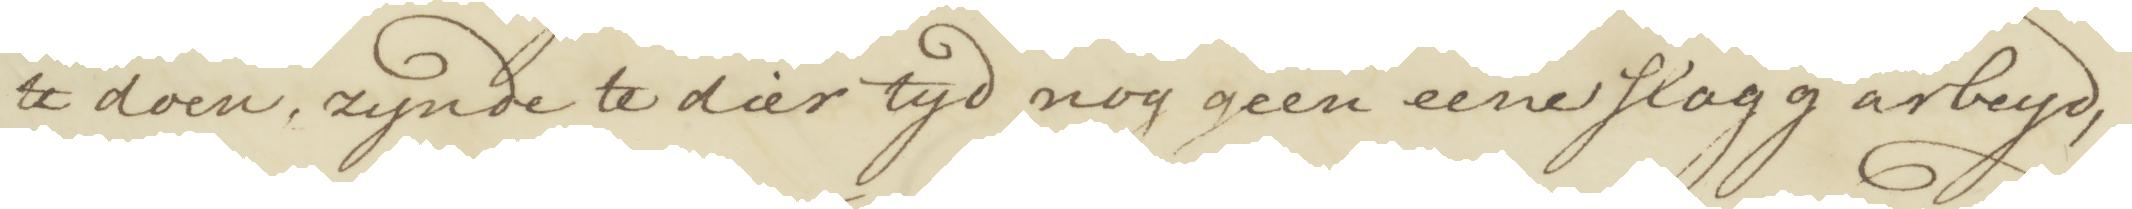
te doen, zynde te dier tyd nog geen eene slag g'arbeyd,
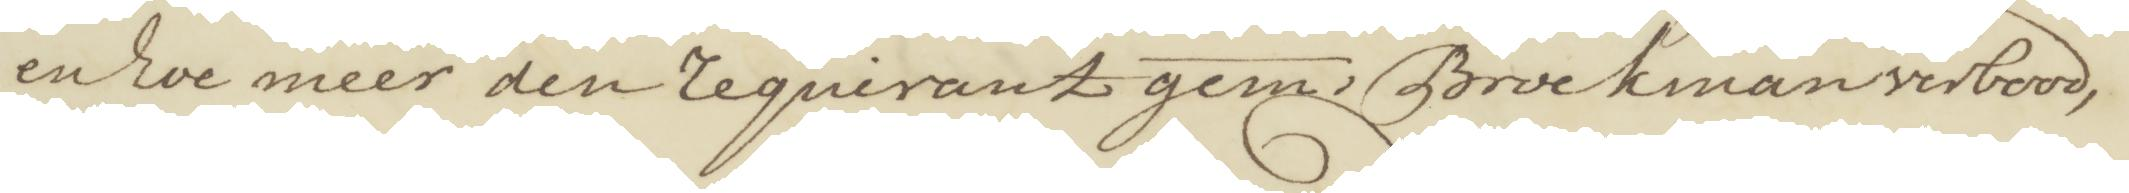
en hoe meer den Requirant gem: Broekman verbood,
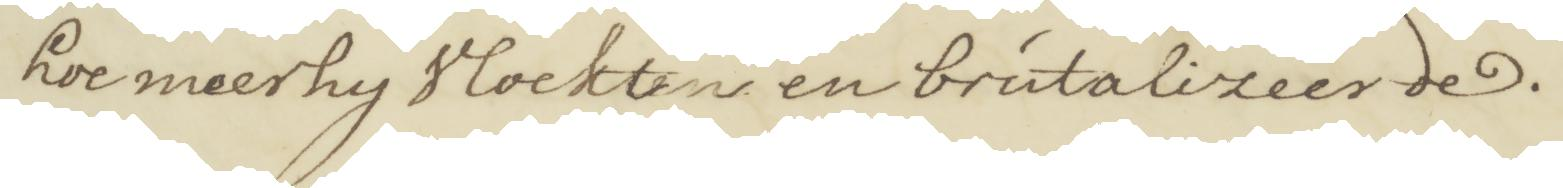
hoe meer hy vloekten en brutalizeerde.
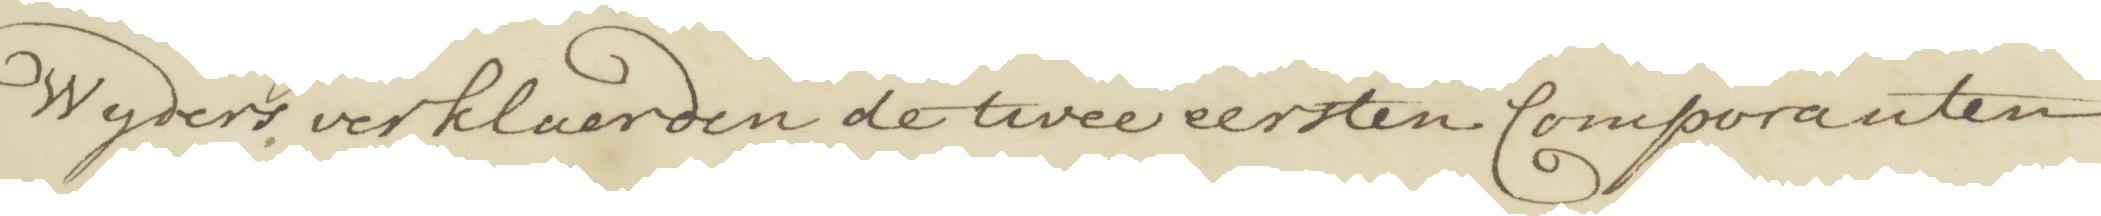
wyders verklaerden de twee eersten Comporanten
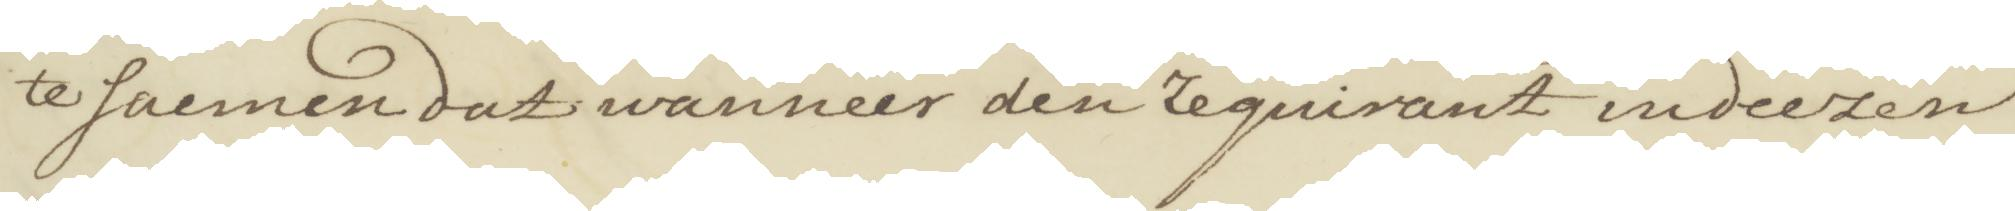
te saemen dat wanneer den Requirant in deezen
